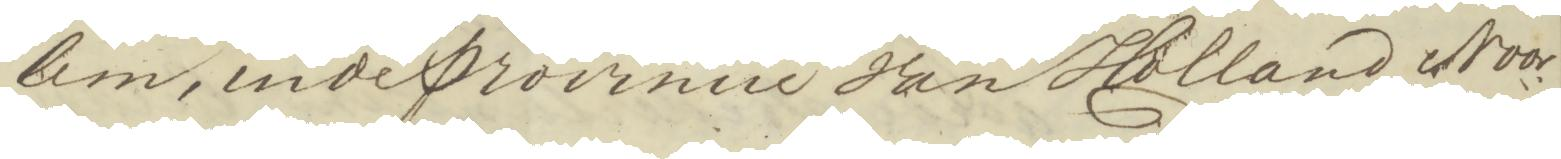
lem, in de provincie van Holland, Noor„
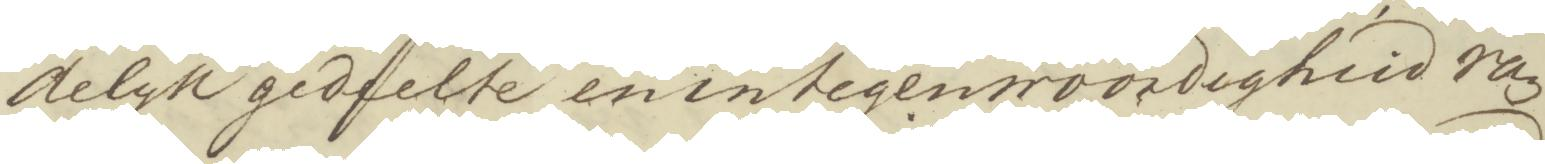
delyk gedeelte en in tegenwoordigheid van
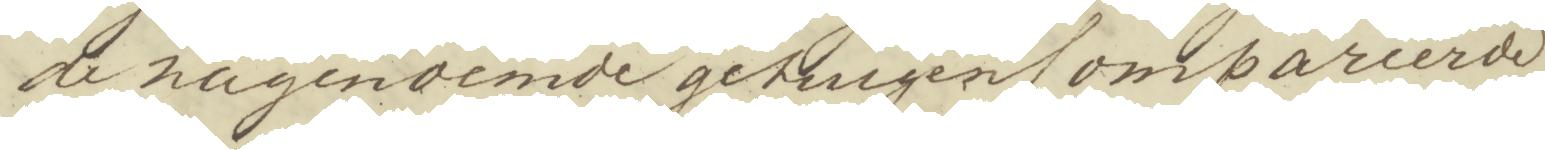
de nagenoemde getuigen Compareerde
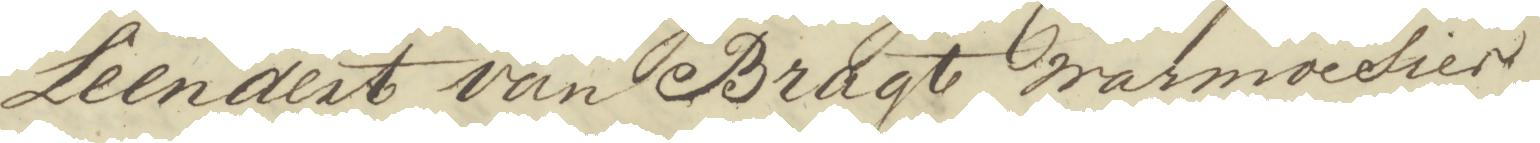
Leendert van Bragt, warmoesier,
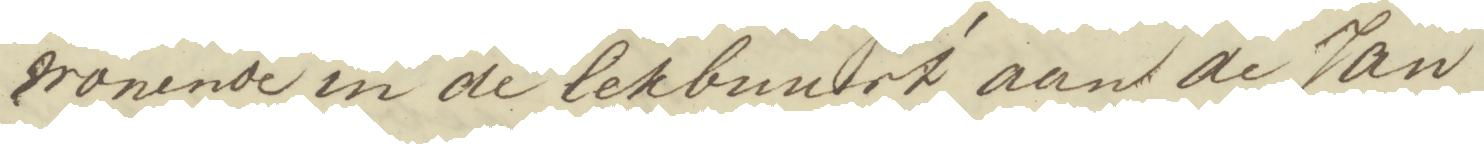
wonende in de lekbuurt aan de Jan
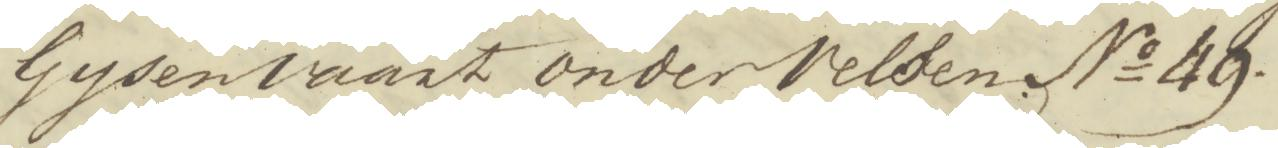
Gysenvaart onder Velsen N=o 49.
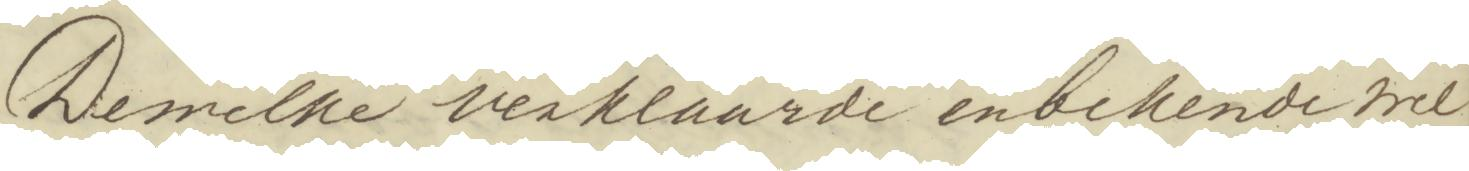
Dewelke verklaarde en bekende wel
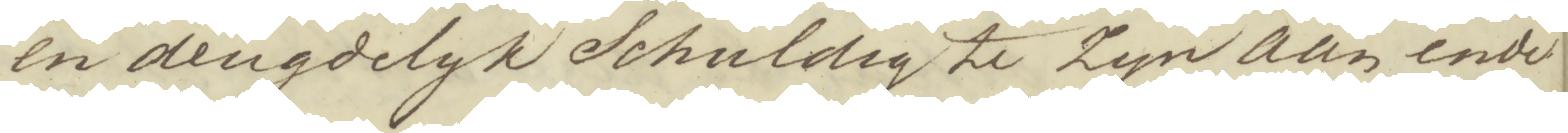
en deugdelijk schuldig te zyn aan ende
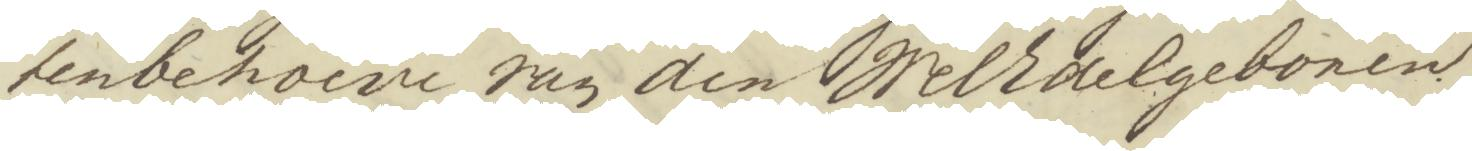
ten behoeve van den WelEdelgeboren
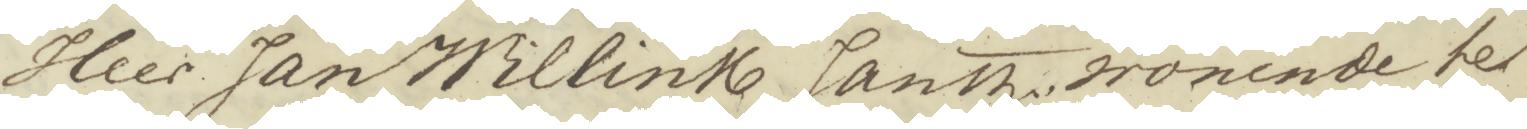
Heer Jan Willink Jantz., wonende te
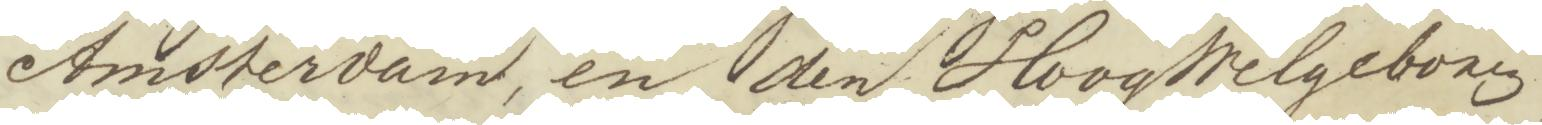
Amsterdam, en den Hoog Welgeboren
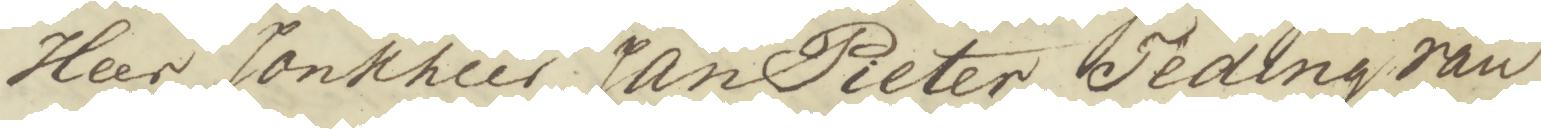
Heer Jonkheer Jan Pieter Teding van
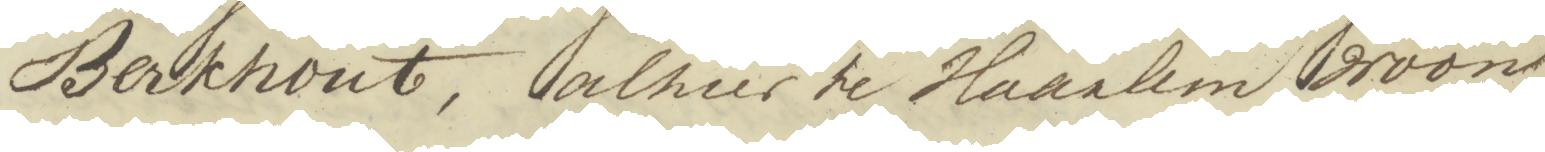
Berkhout, alhier te Haarlem woon„
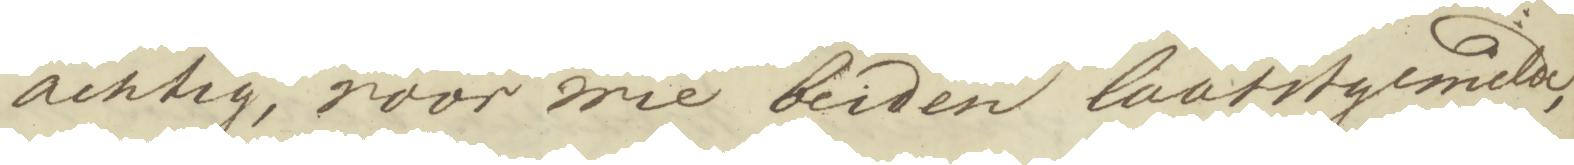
achtig, voor wie beiden laatstgemelde,
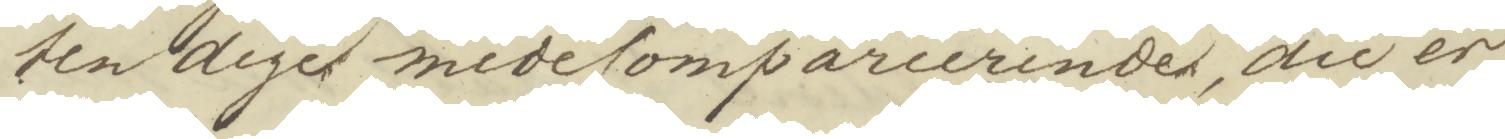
ten dezes mede compareerende, die er
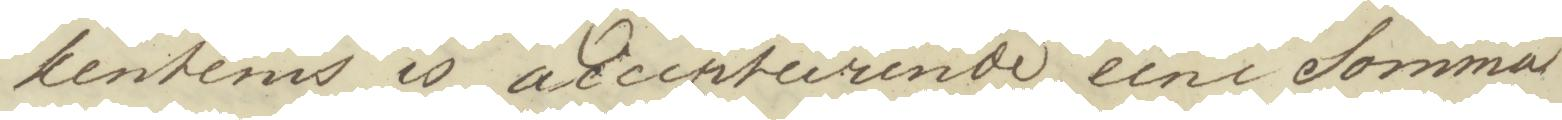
kentenis is accepteerende, eene somma
